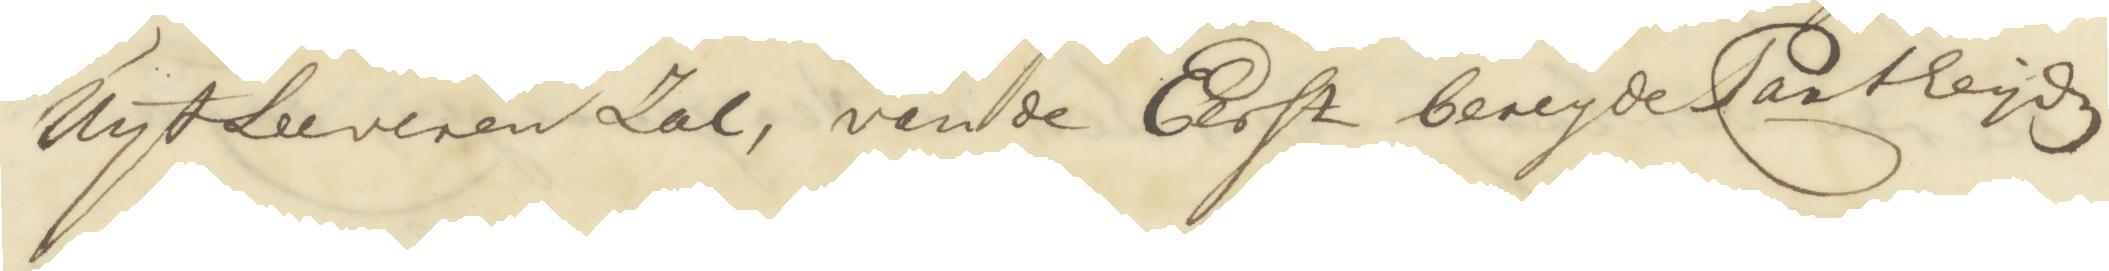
uijtleeveren zal, van de Eerst bereijde Partheijen
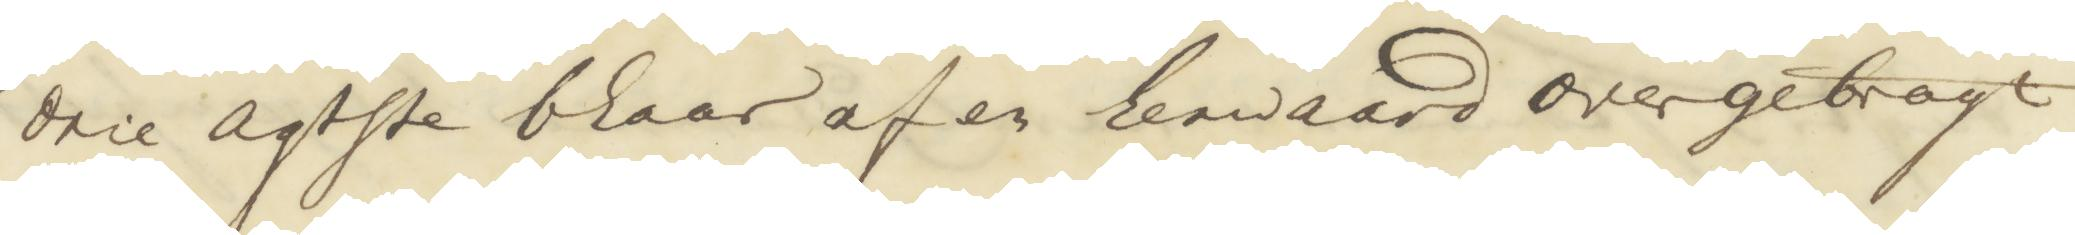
drie agtste bhaar af en herwaard overgebragt
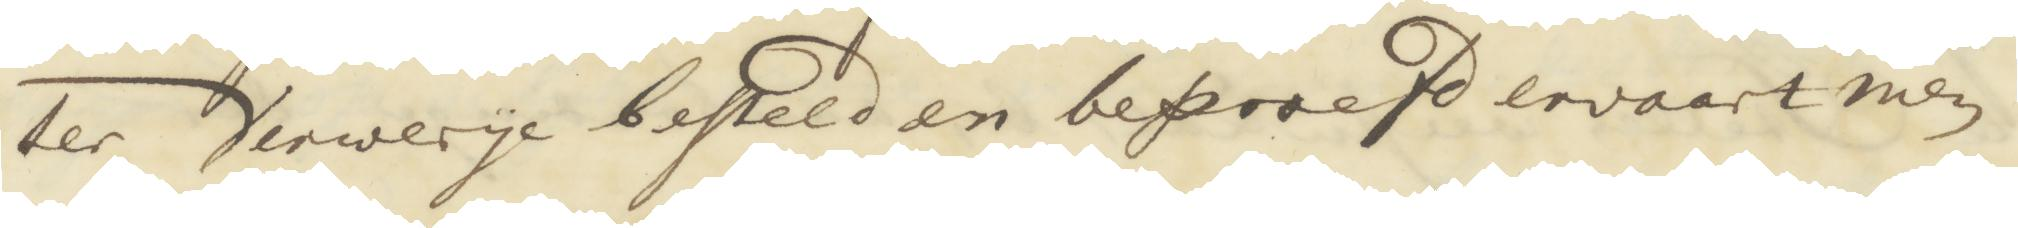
ter Verwerije besteld en beproefd ervaart men
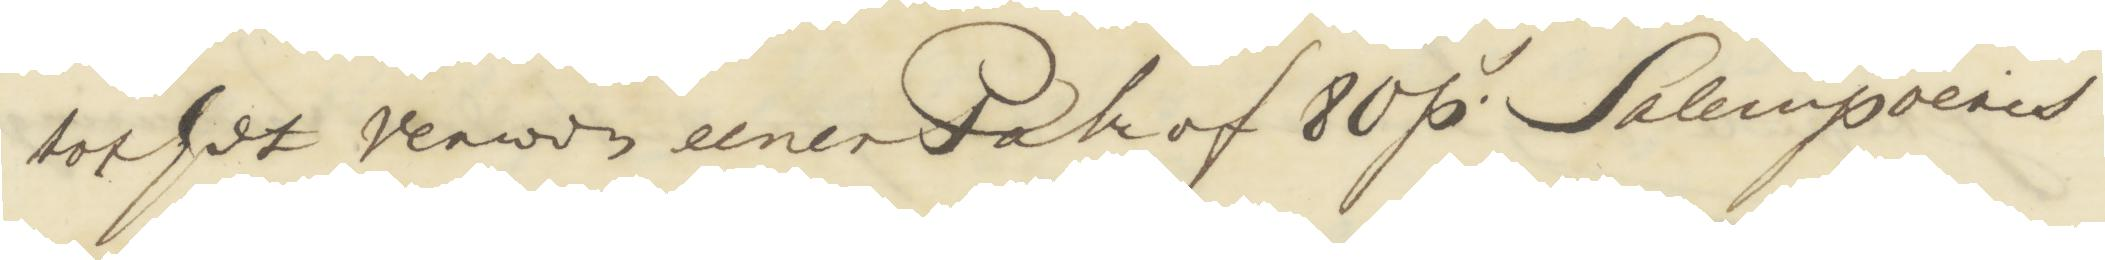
tot het verwen eener Pak of 80 p.s salempoeris
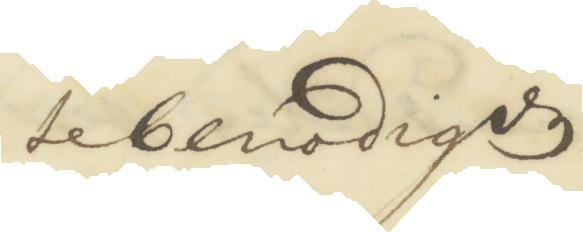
te benodigen
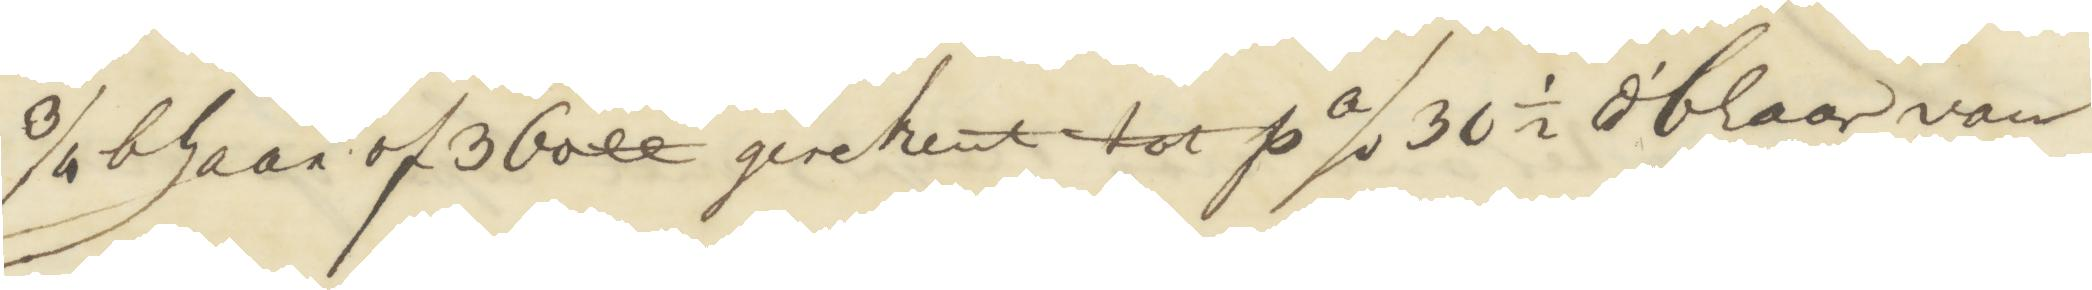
3/4 bhaar of 360lb gerekent tot pa/o 30½ d'bhaar van
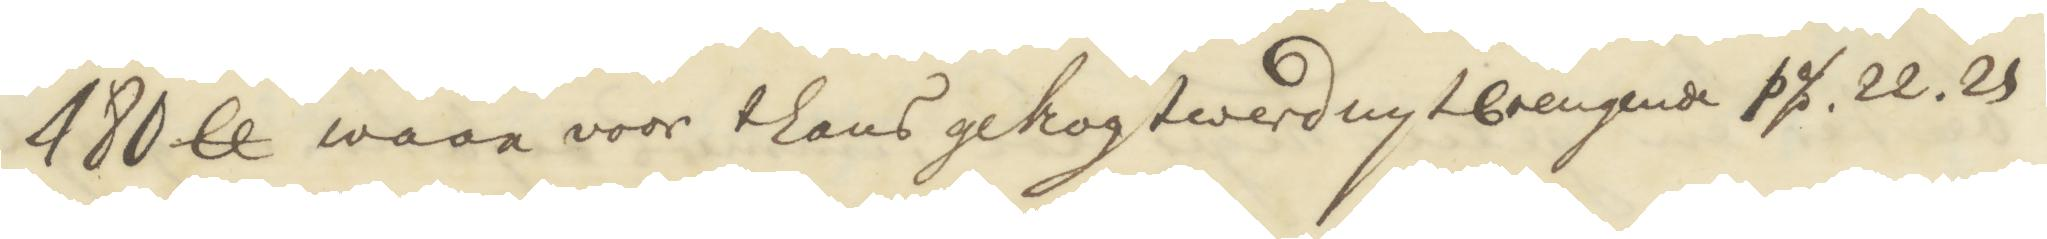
480 lb waar voor thans gekogt werd uytbrengende pa/o. 22. 21
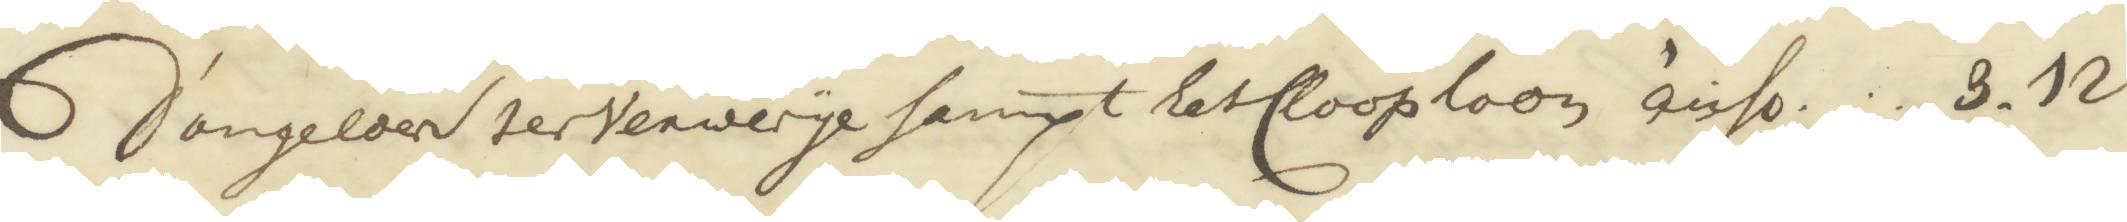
d'ongelden ter verwerije sampt het Clooploon anso . . . 3. 12
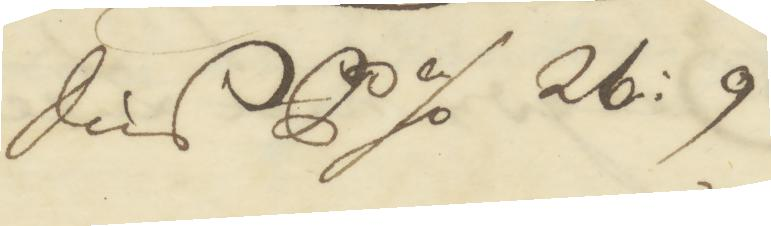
dus Pa/o 26: 9
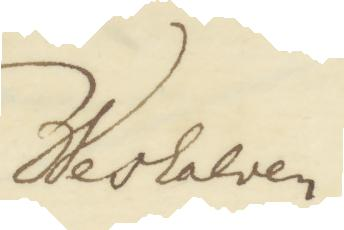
Weshalven
